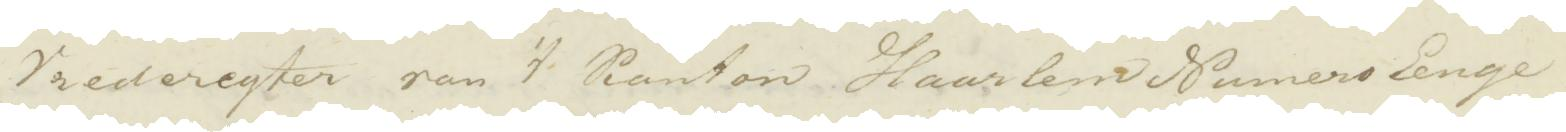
Vrederegter van 7 Kanton Haarlem Numero Een ge
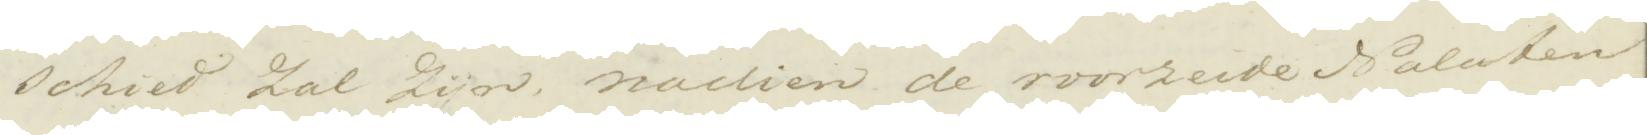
schied zal zijn, nadien de voorzeide Nalaten
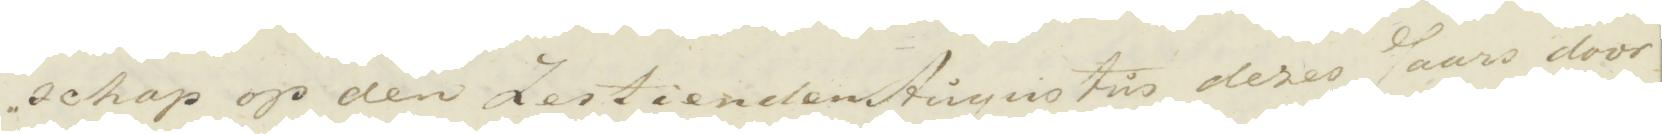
„schap op den Zestienden Augustus dezes Jaars door
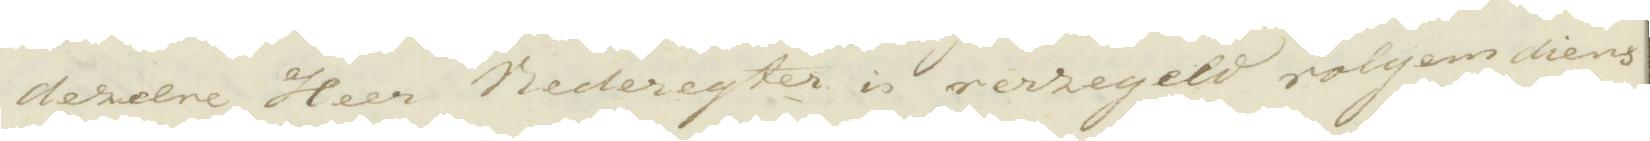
dezelve Heer Vrederegter is verzegeld volgens diens
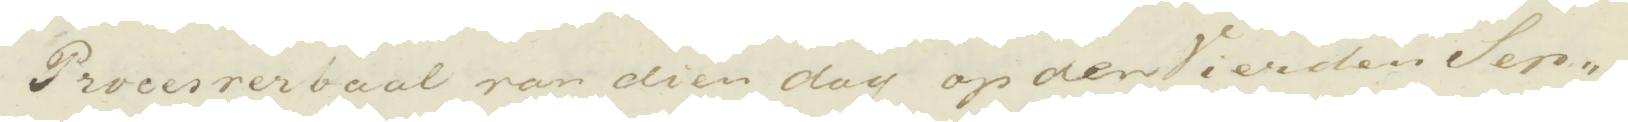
Proces verbaal van dien dag op de Vierden Sep„
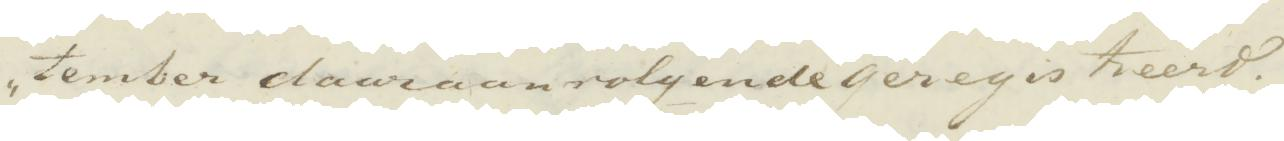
„tember daaraan volgende geregistreerd.
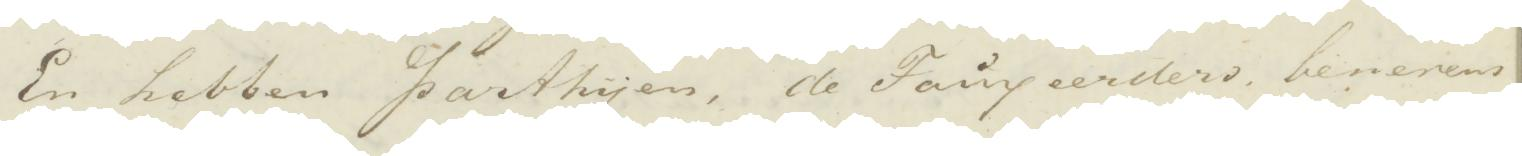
En hebben parthijen, de Tauxeerders, benevens
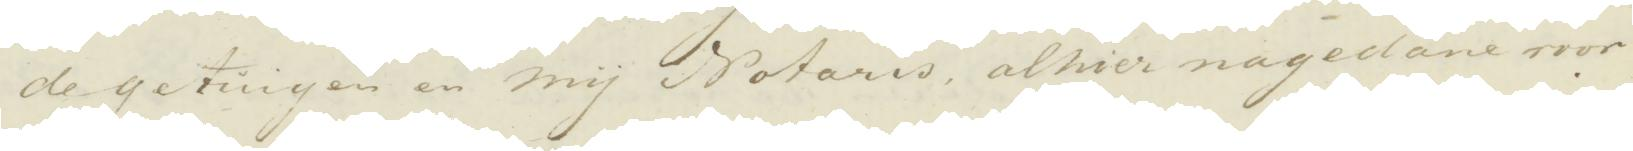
de getuigen en mij Notaris, alhier na gedane voor
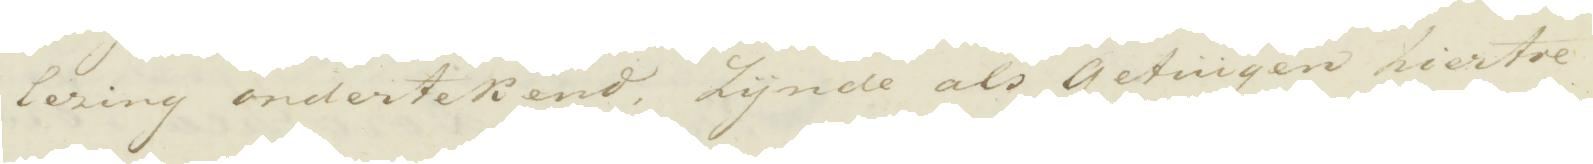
lezing ondertekend, zijnde als getuigen hier toe
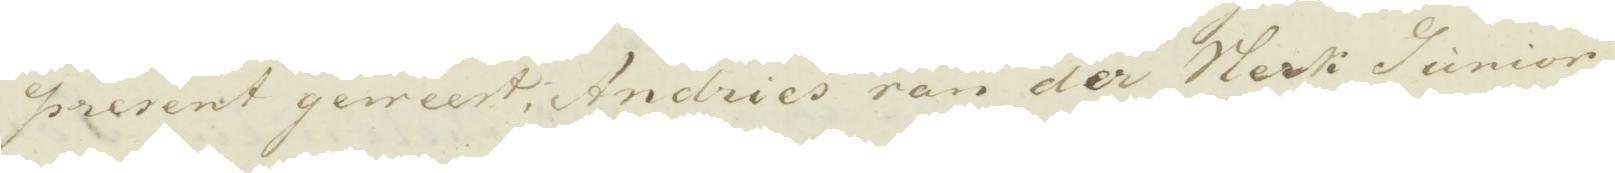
present geweest, Andries van der Vlerk Junior
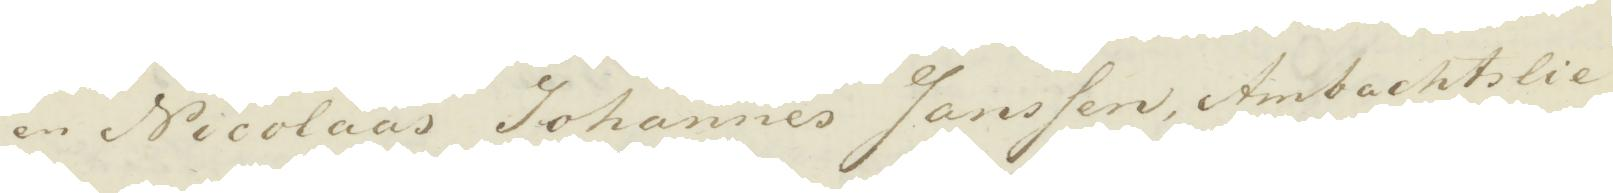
en Nicolaas Johannes Janssen, Ambachtlie
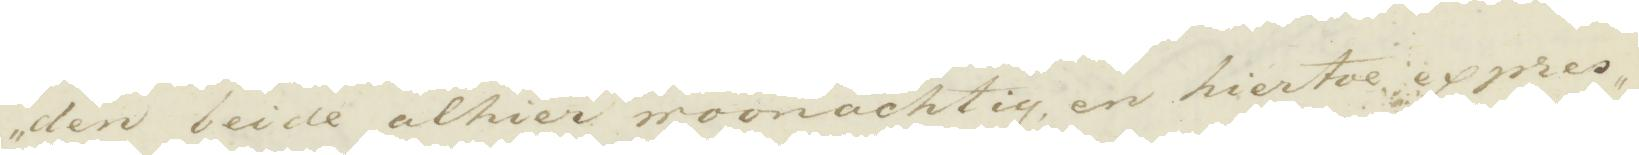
„den beide alhier woonachtig, en hiertoe expres„
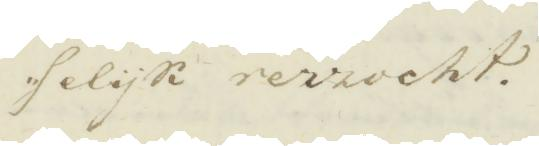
selijk verzocht.
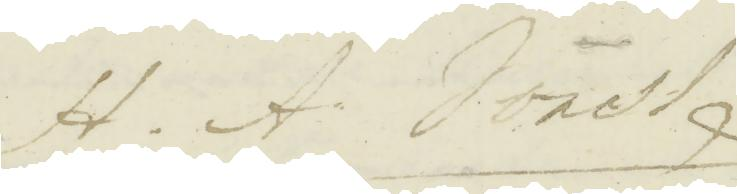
H. A: Dorst
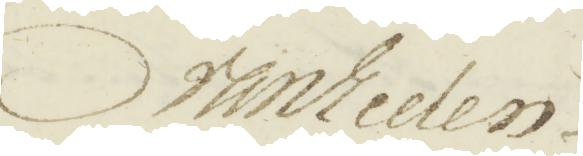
van heelen.
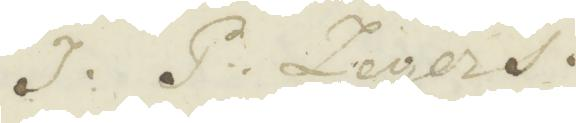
J: P: Levers.
